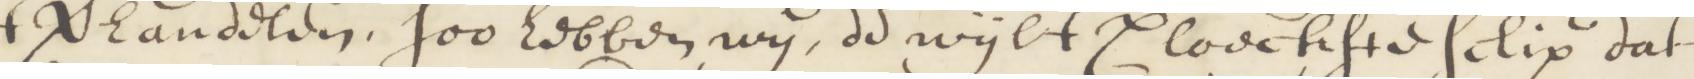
t verhandelen, soo hebben wij, de wijl t Cloeckste schip dat
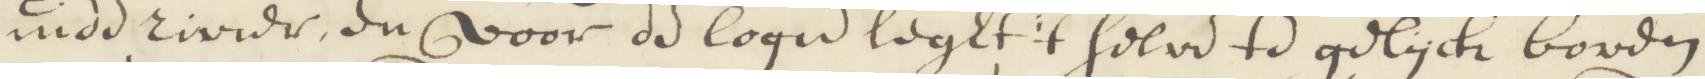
inde rivier, en voor de logie leght 't selve te gelijck boven
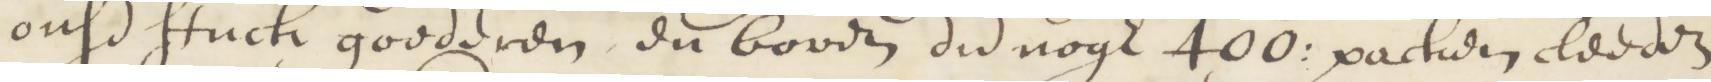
onse stuck goederen en boven die nogh 400: packen cleeden
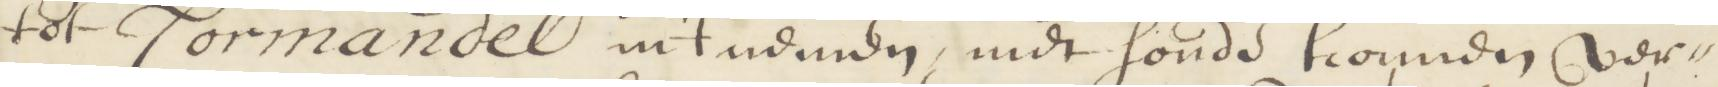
tot Cormandel in't nemen, niet soude konnen ver„
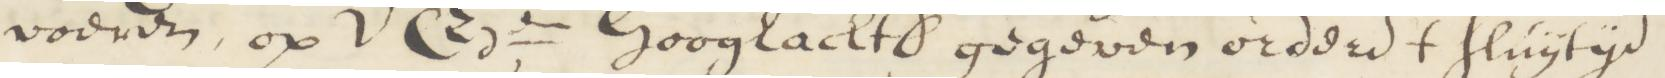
voeren, op UEd-e Hooghachtb gegeven ordere t sluijtijd
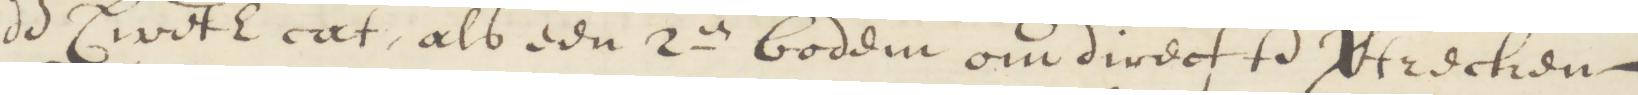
de Civete cat, als een 2-en bodem om direct te vertrecken
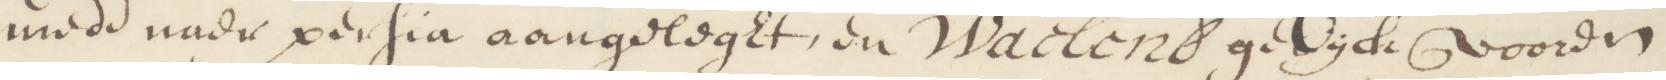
mede naer persia aangeleght, en Waelens gelijck vooren
